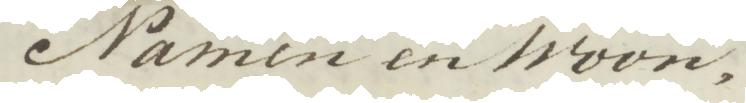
Namen en Woon„
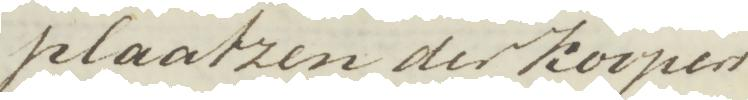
plaatzen der Koopers
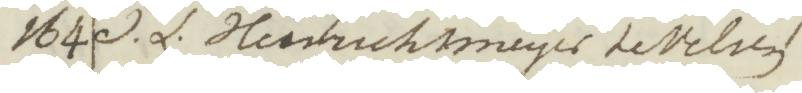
164 J. L. Henrichsmeyer te Velsen
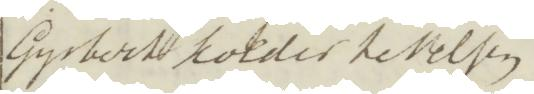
Gysbert kolder te Velsen
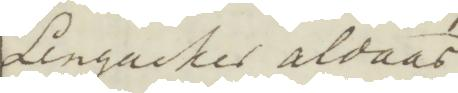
Lengacker aldaar
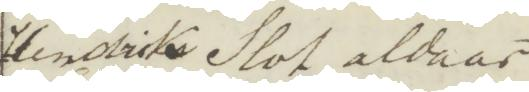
Hendrik Slot aldaar
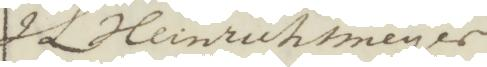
J L Heinrich meyer
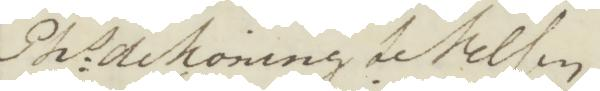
Ph:s de koning te Velsen
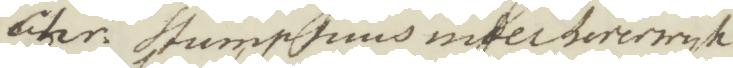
chr: Stumphius in de Beverwyk
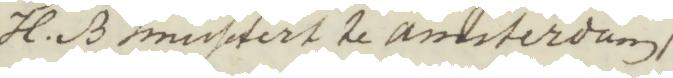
H. B Mustert te amsterdam,
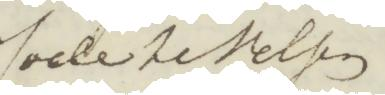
Wm Coele te Velsen
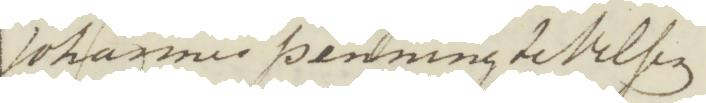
Johannes Penning te Velsen
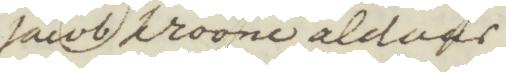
Jacob kroone aldaar
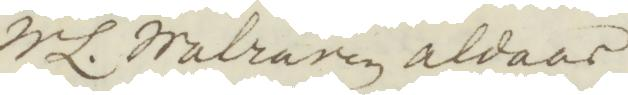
WL. Walraven aldaar
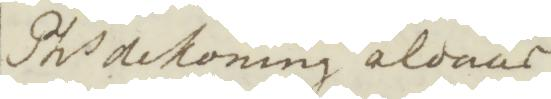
Phs de koning aldaar
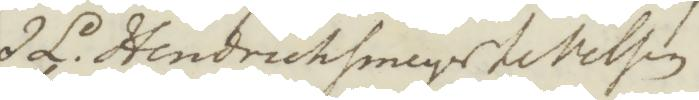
J L. Hendrichsmeyer te Velsen
